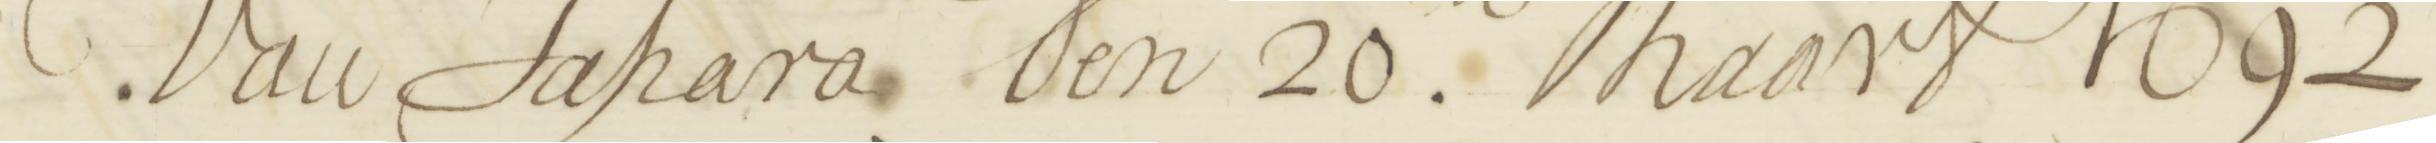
Van Iapara den 20.en Maart 1692
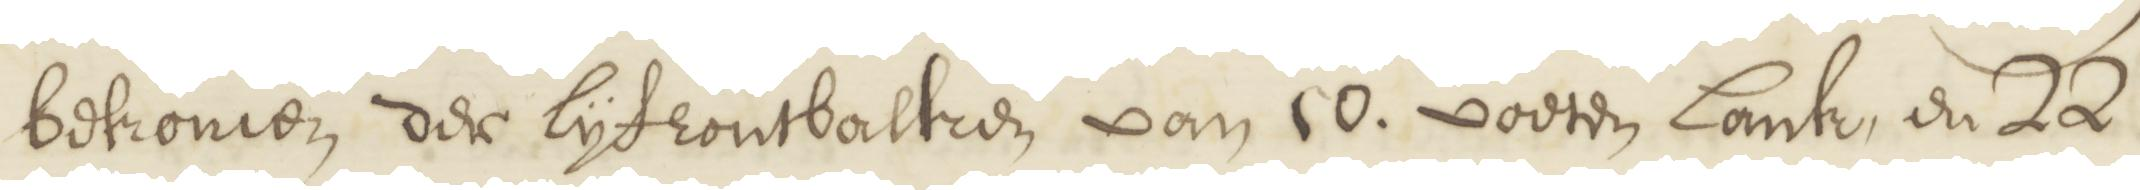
bekomen der lijfhoutbalken van 50. voeten lank, en 22
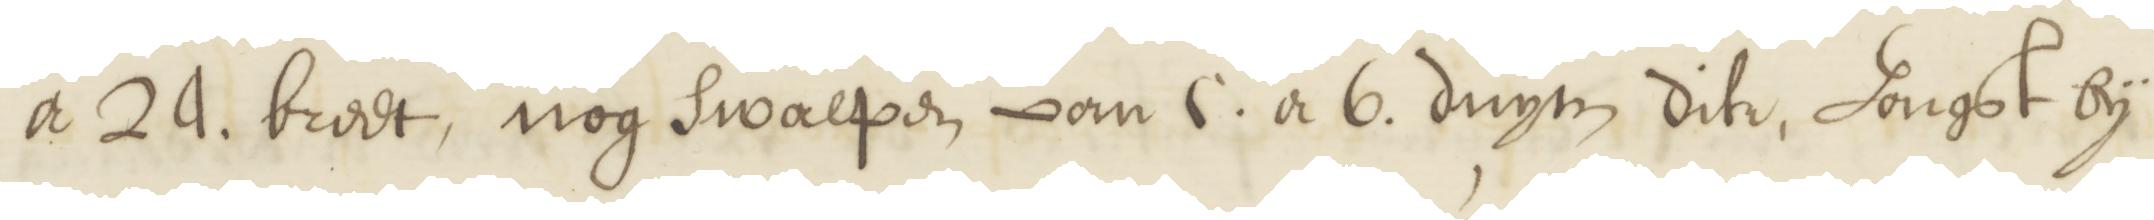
â 24. breet, nog swalpen van 5. â 6. duijten dik, iongst bij
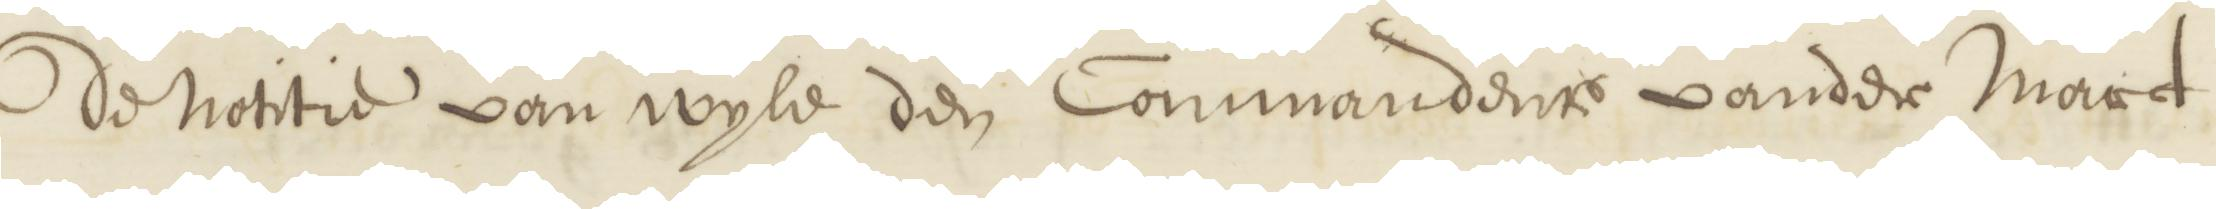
de notitie van wyle den Commandeur vander Marct
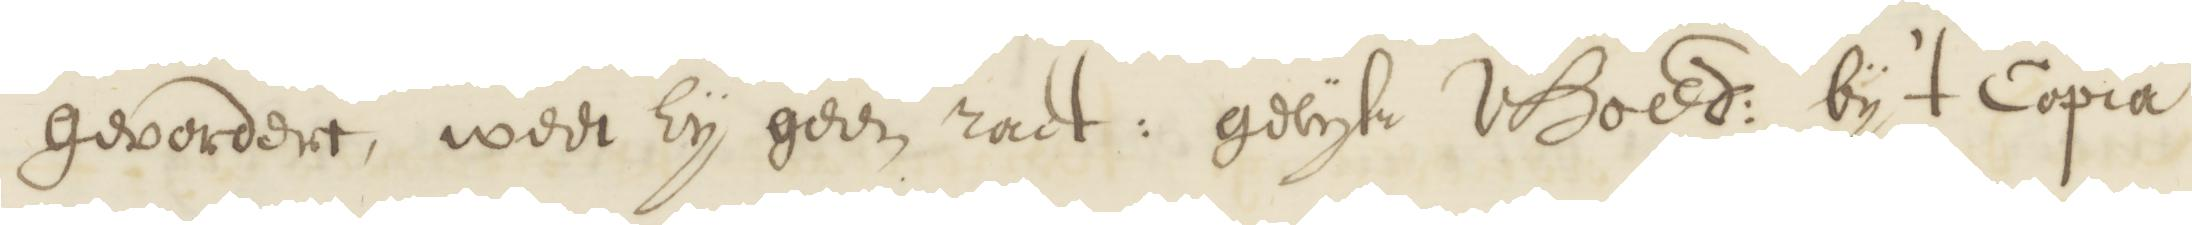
gevordert, weet hij geen raet: gelijk vHoEd: bij ’t Copia
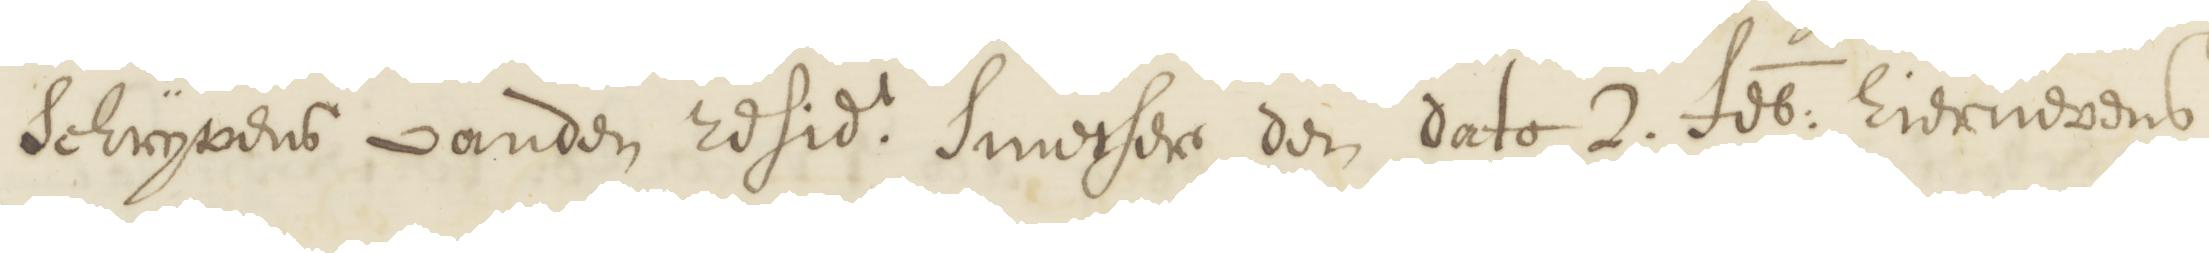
schrijvens vanden resid.t smetser den dato 2. feb: hiernevens
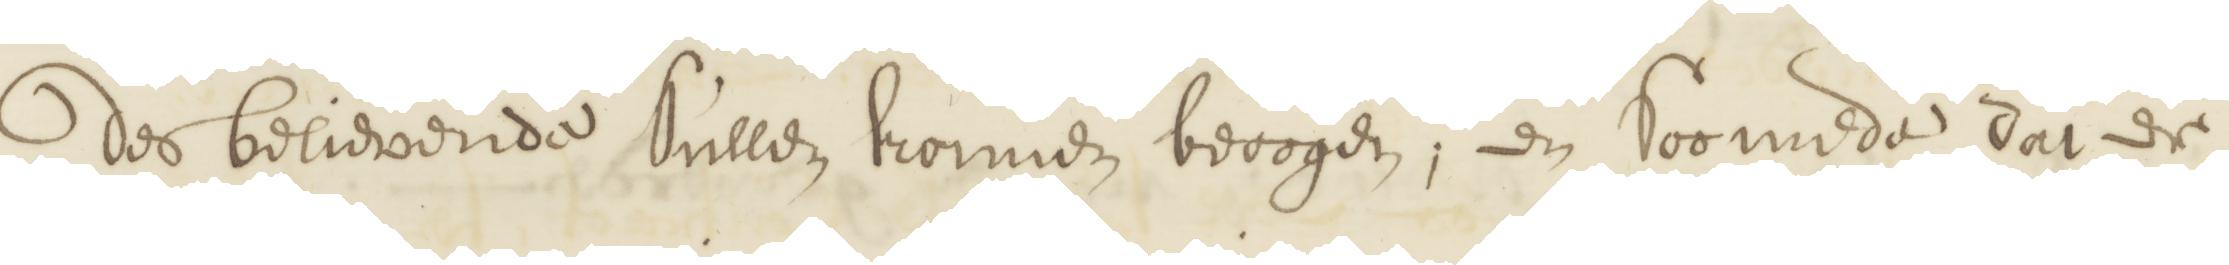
des believende sullen konnen beoogen; en soo mede dat 'er
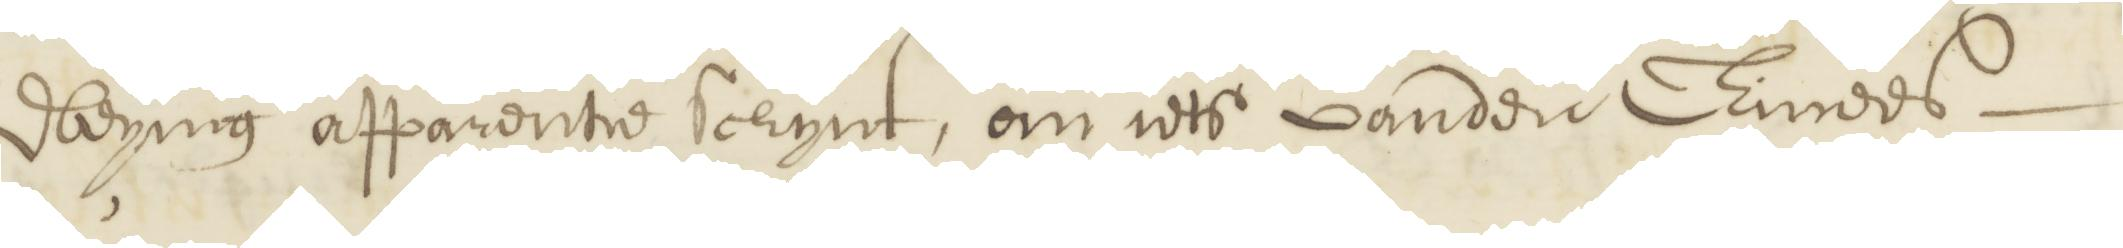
weijnig apparentie schijnt, om iets vanden Chinees —
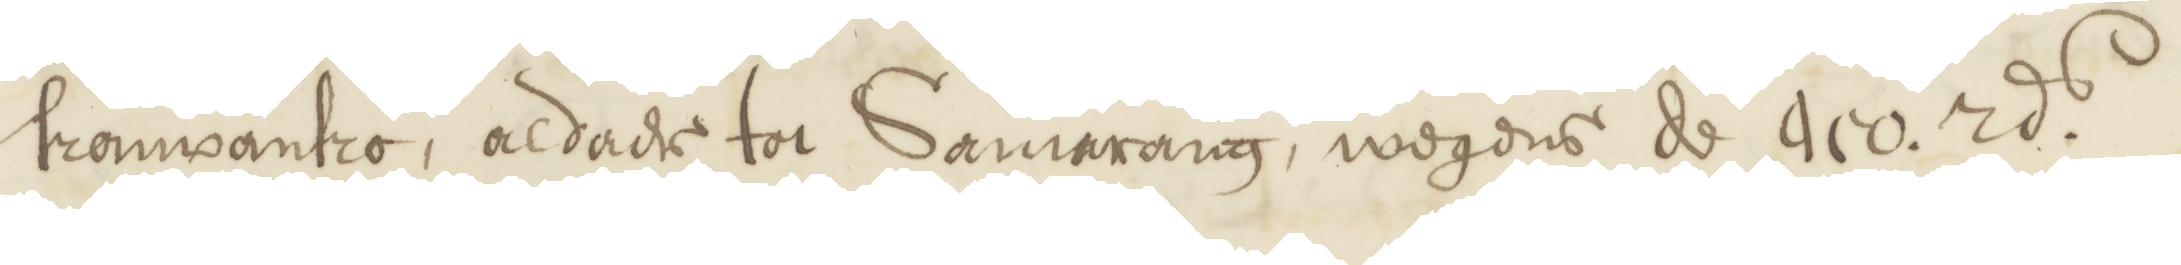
kouwanko, aldaer tot Samarang, wegens de 450. rd.s
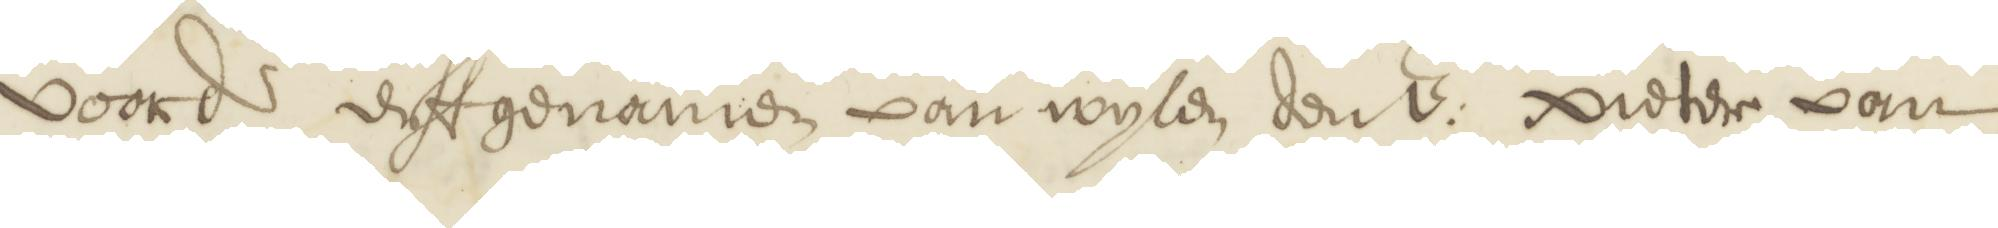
voor de erffgenamen van wijlen den E: pieter van
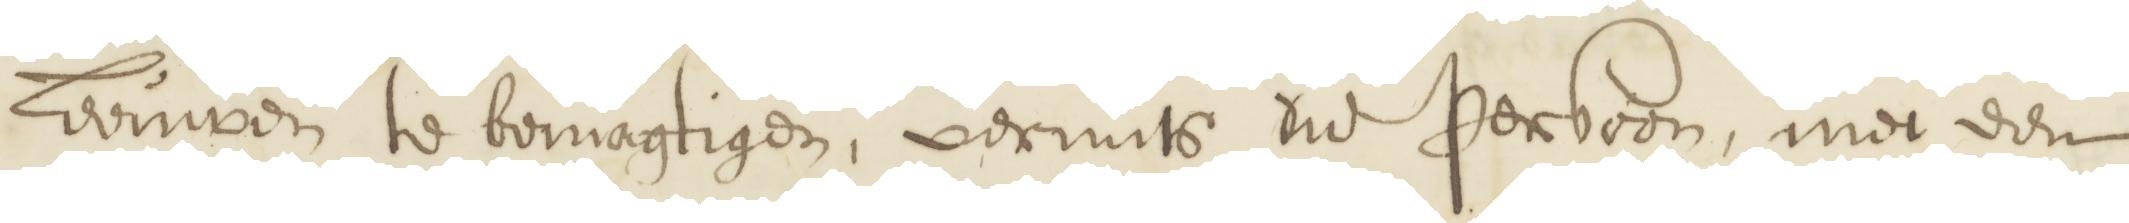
leeuwen te bemagtigen, vermits die persoon, met een
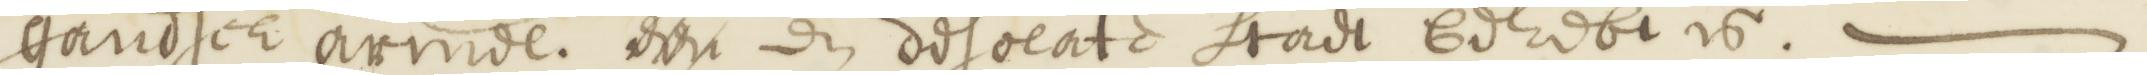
gandsch armel. een en desolate staet behebt is. —
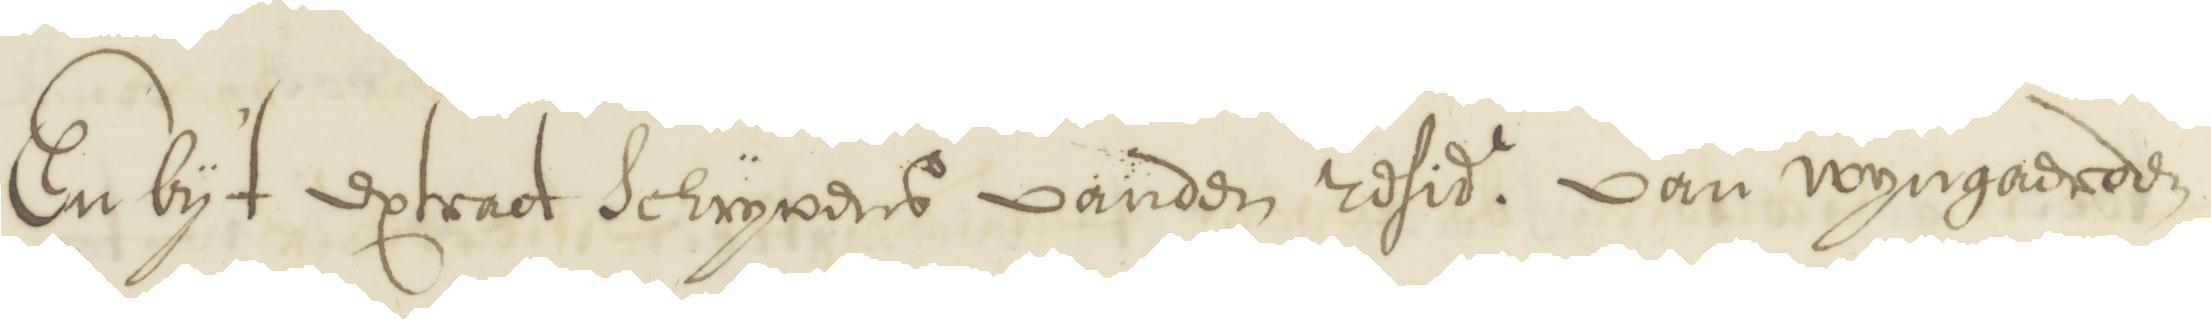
En bij ’t extract schrijvens vanden resid.t van wijngaerden
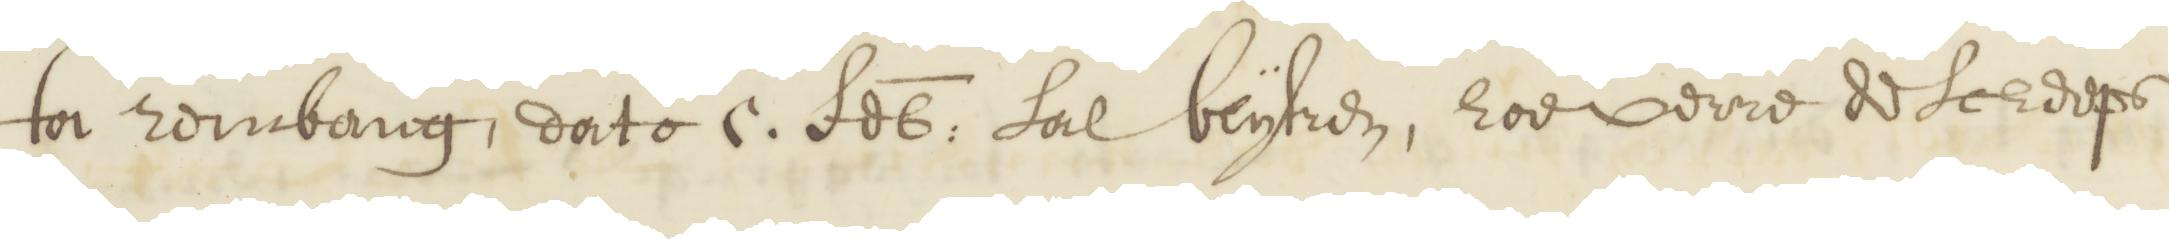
tot rembang, dato 5. feb: sal blijken, hoeverre de scheeps
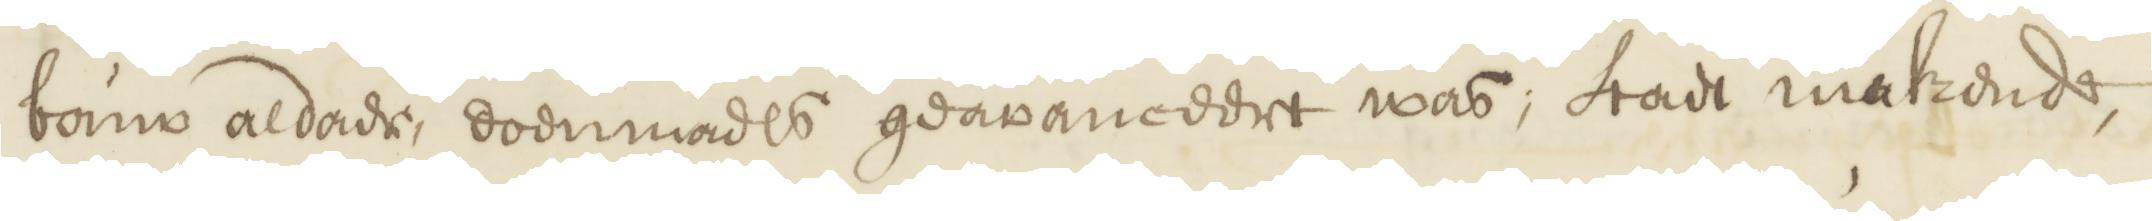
bouw aldaer, doenmaels geavanceert was; staet makende,
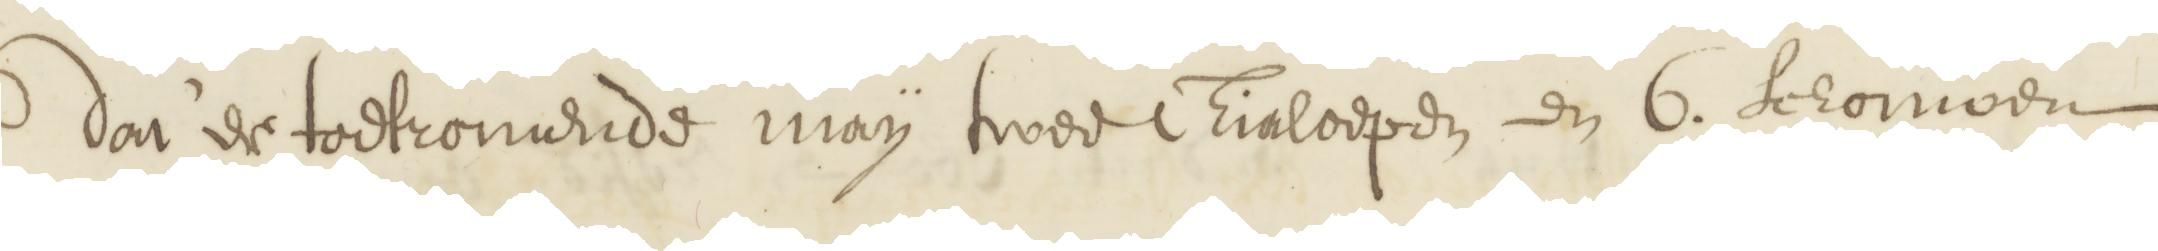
dat 'er toekomende maij twee chialoepen en 6. schouwen
